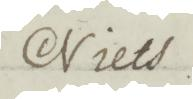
Niets
